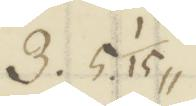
3. 5. 1/15„
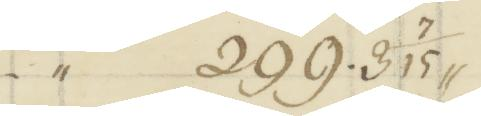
„ 299.3 7/15„
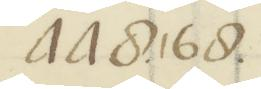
448.168.
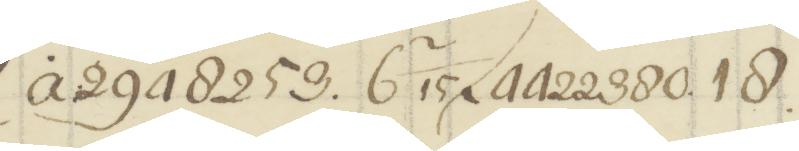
Ro/a 2948253. 6 2/15 ƒ4422380.18
